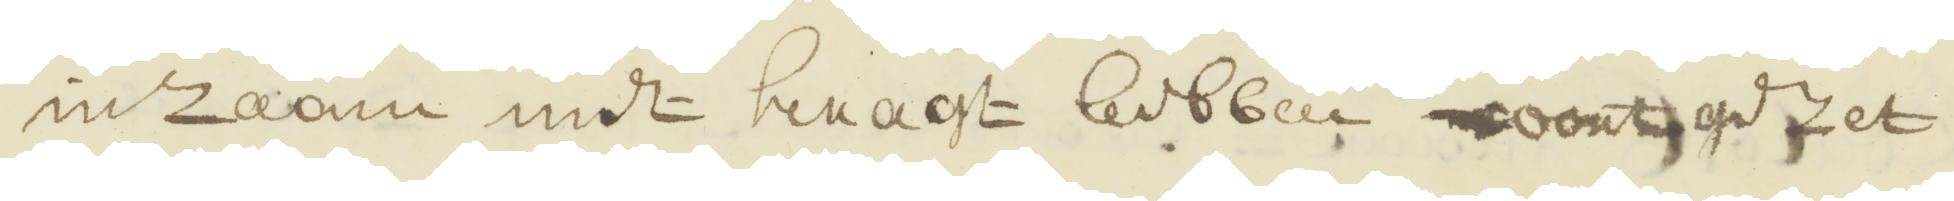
inzaam met kragt hebben voortgezet
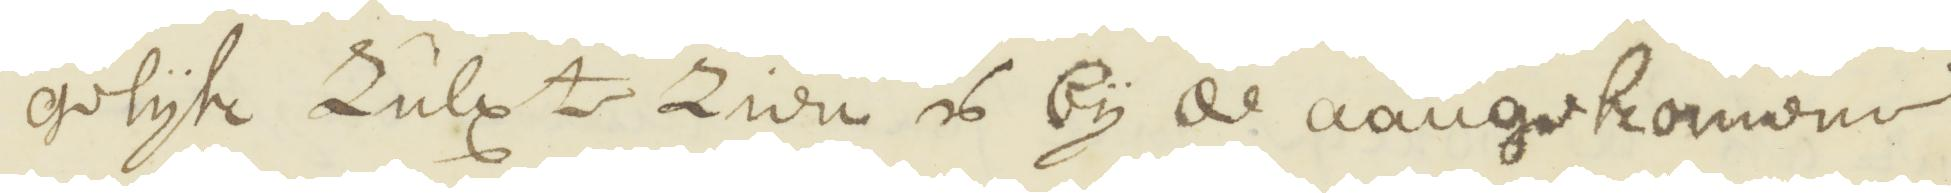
gelijk zulx te zien is bij de aangekomene
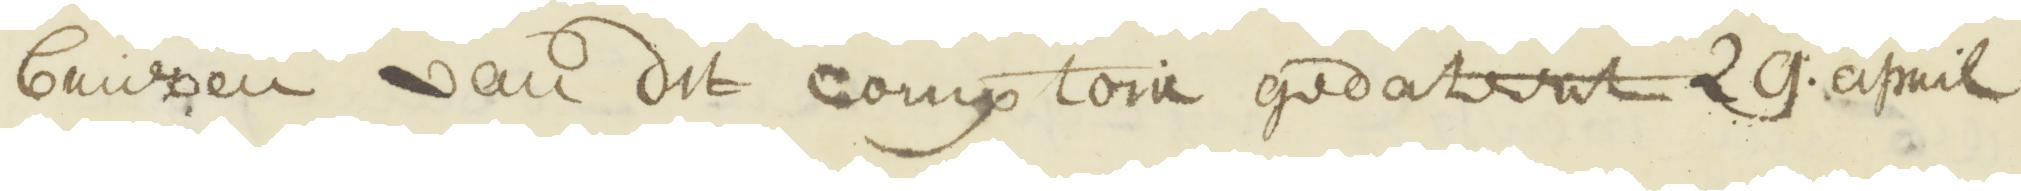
brieven van dit comptoir gedateert 29: april
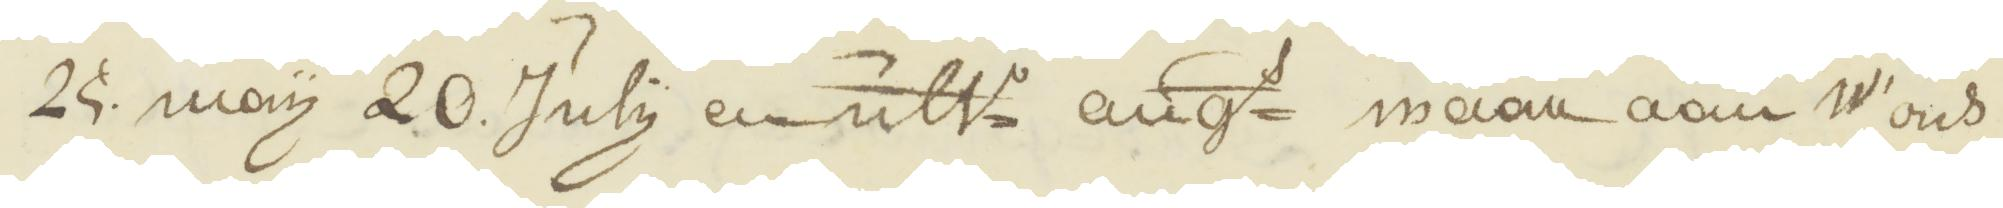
25. maij 20. Julij en ult=o aug=s waar aan w' ons
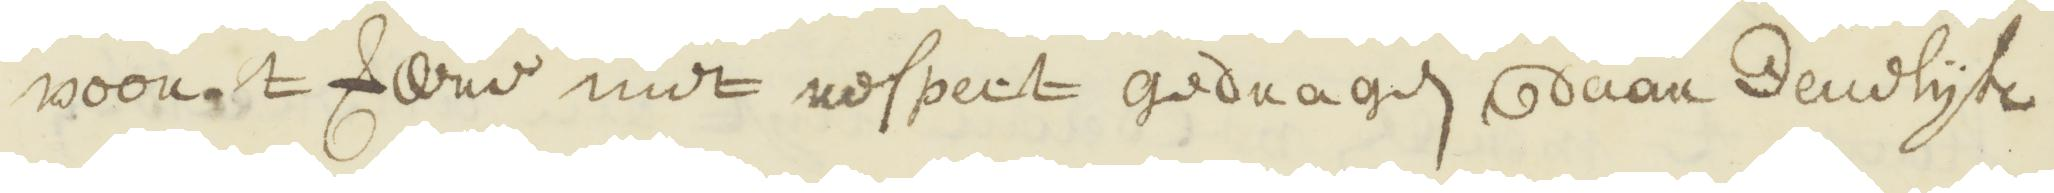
voor 't verdere met respect gedragen daar Eenelijk
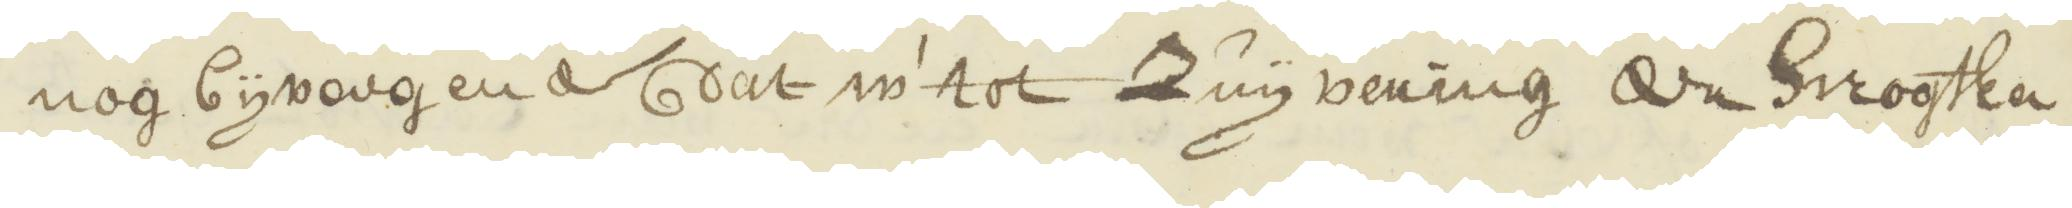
nog bijvoegen de dat w' tot zuijvering der Sirogtha
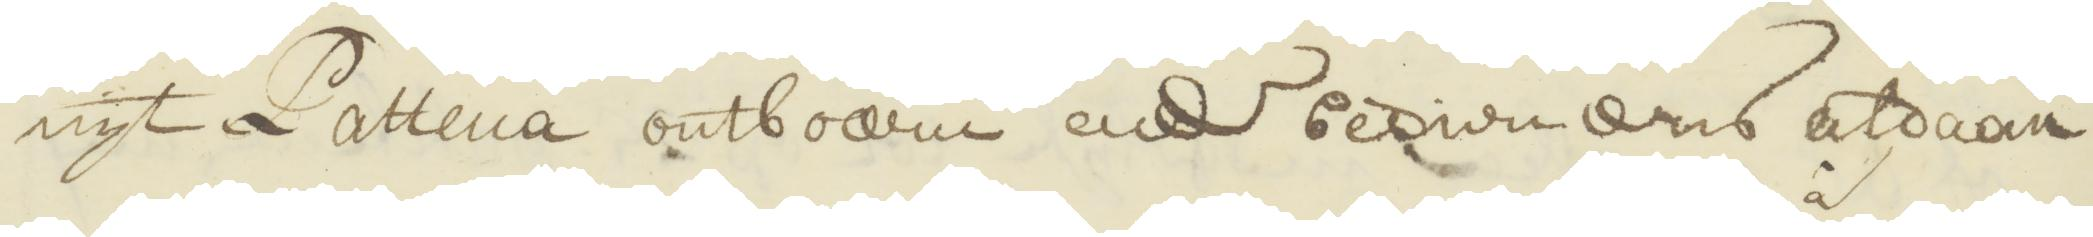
uijt Pattena ontbodene ende bediendens aldaar
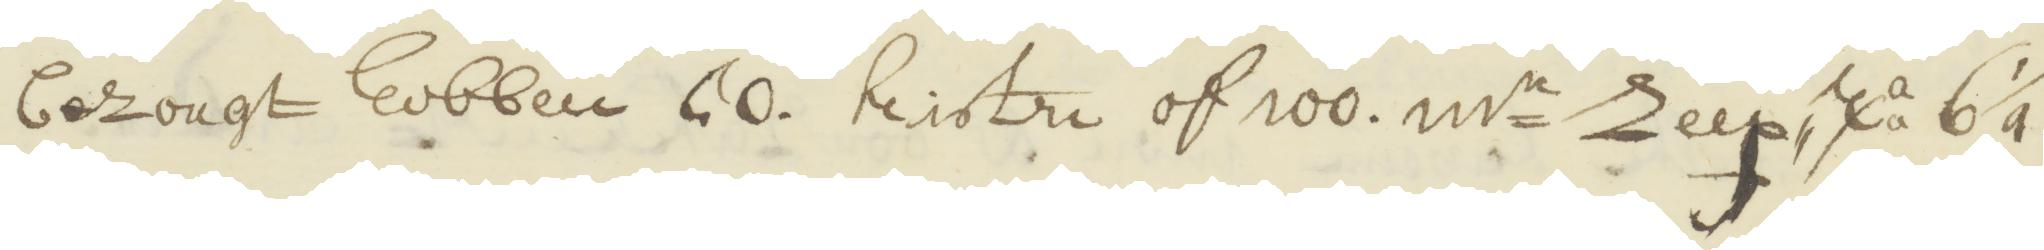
bezorgt hebben 50. kisten of 100. m=r zeep„ r/oa 6¼
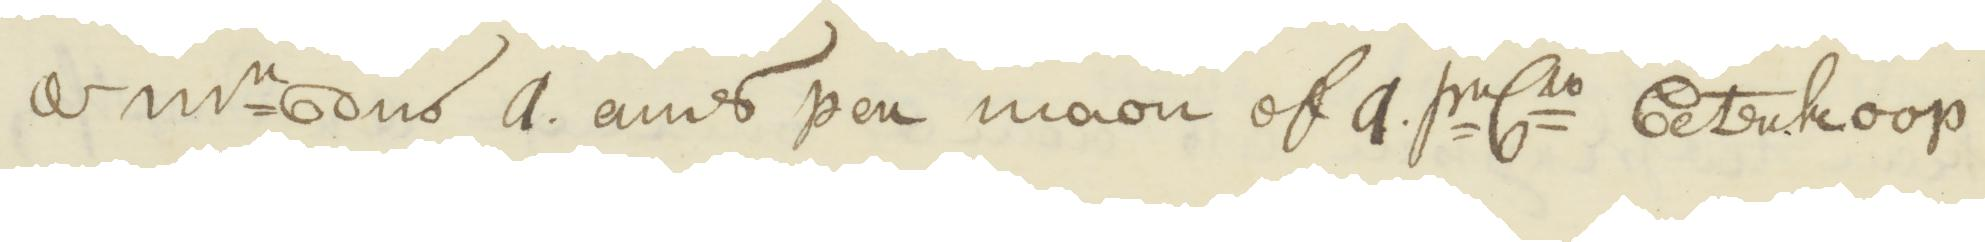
de m=r dus 4. anes per maon of 4. p=r C=to beterkoop
